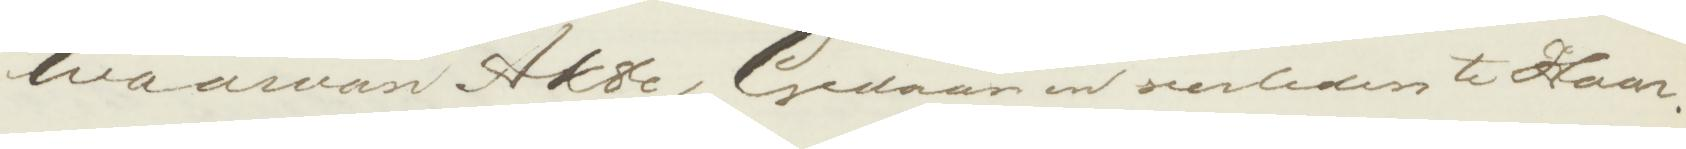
waarvan Akte, Gedaan in verleden te Haar
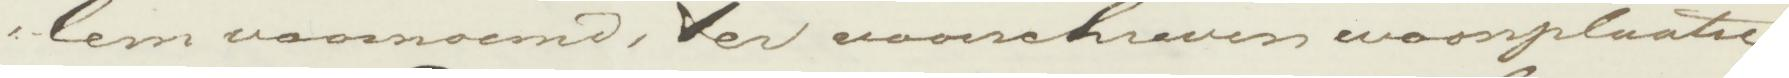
„-lem voornoemd, ter voorschreven woonplaatse
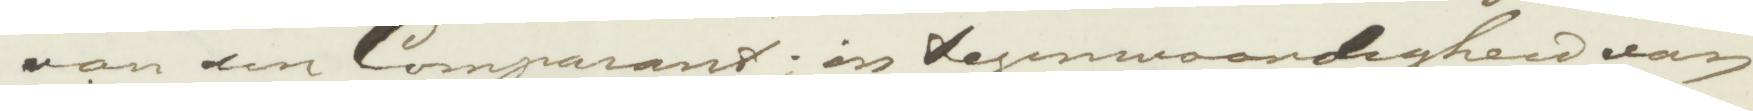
van den Comparant; in tegenwoordigheid van
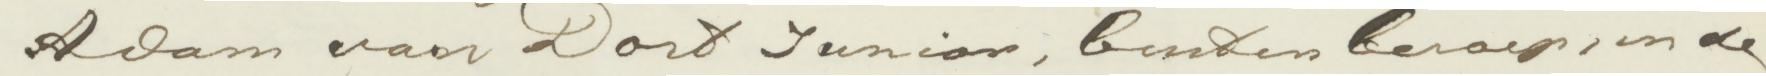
Adam van Dort Junior, buiten beroep, in den
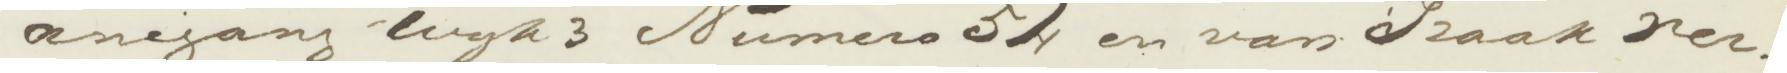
anegang wyk 3 Numero 54 en van Izaak ver.
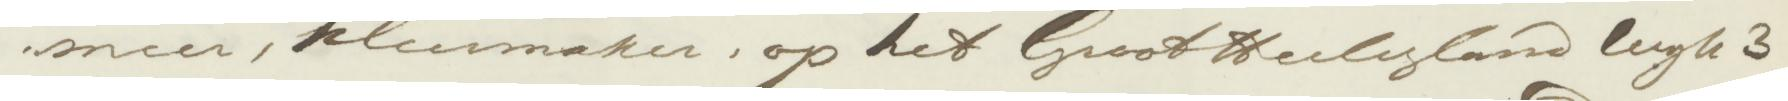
.meer, kleermaker, op het Groot Heiligland wyk 3
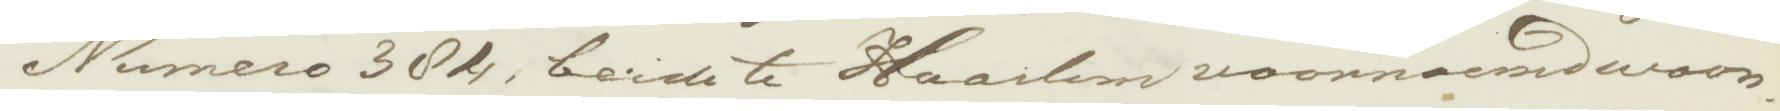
Numero 384, beide te Haarlem voornoemd woon
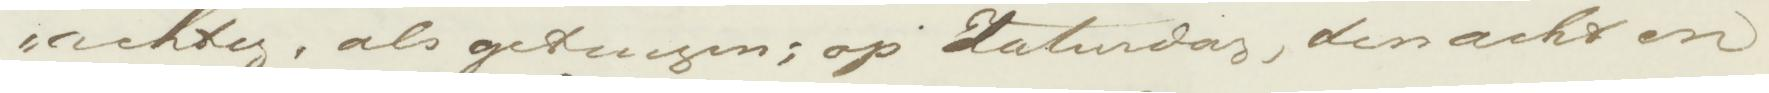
„achtig, als getuigen; op Zaturdag, den acht en
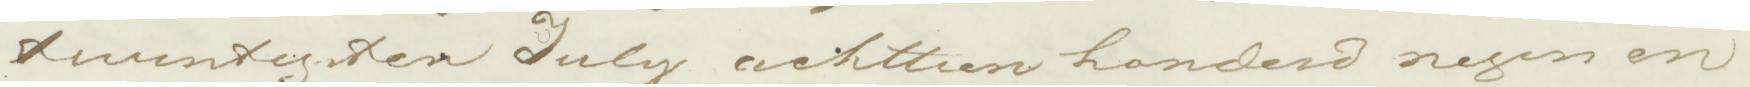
twintigsten Iuly achttien honderd negen en
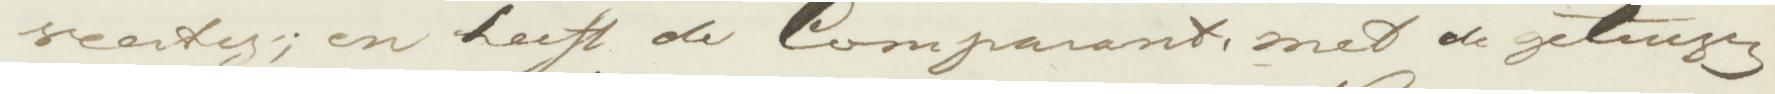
veertig; en heeft de Comparant, met de getuigen
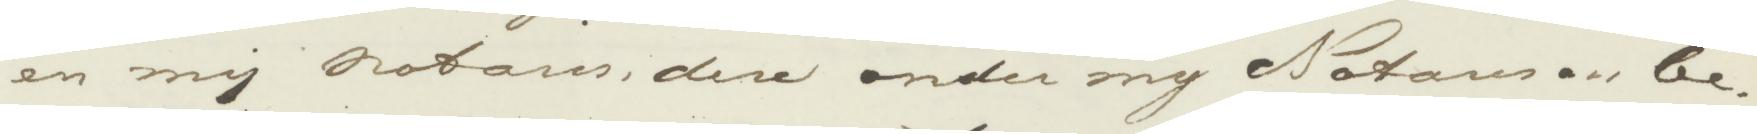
en mij notaris, deze onder my Notaris in be.
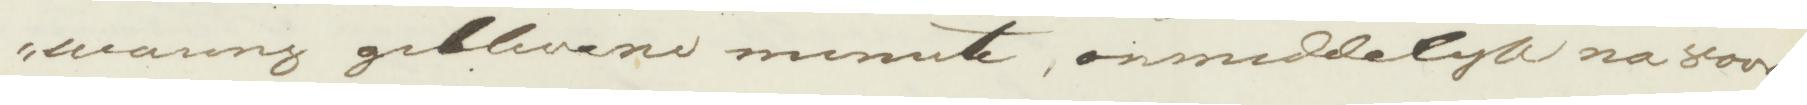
„waring geblevene minute, onmiddelyk na voor.
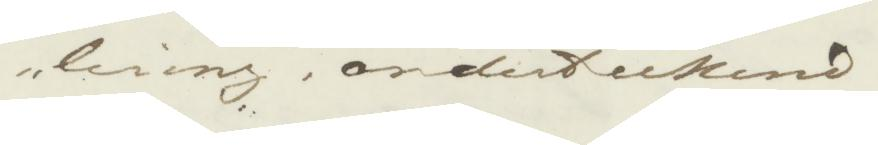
„lezing, onderteekend
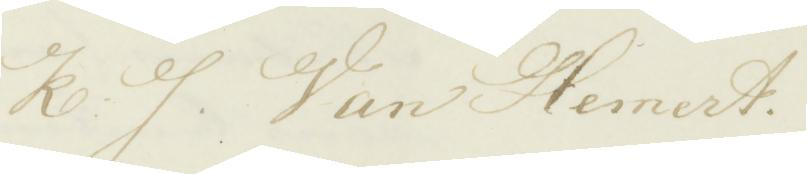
K: J. Van Hemert.
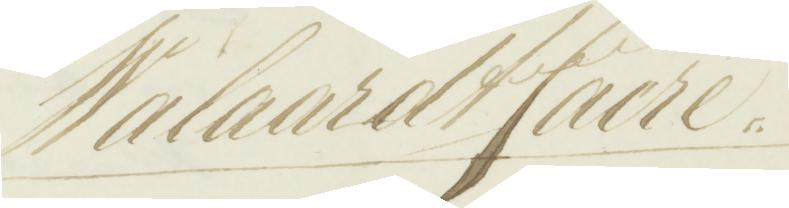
Walaardt Sacré..
